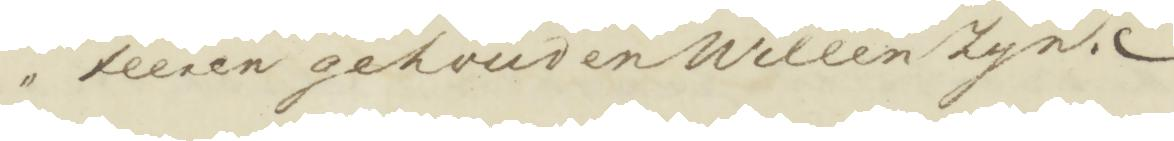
teeren gehouden willen zijn.—
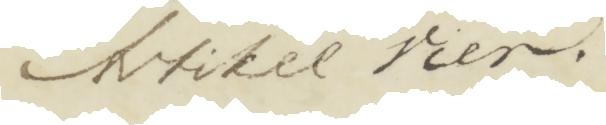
Artikel vier.
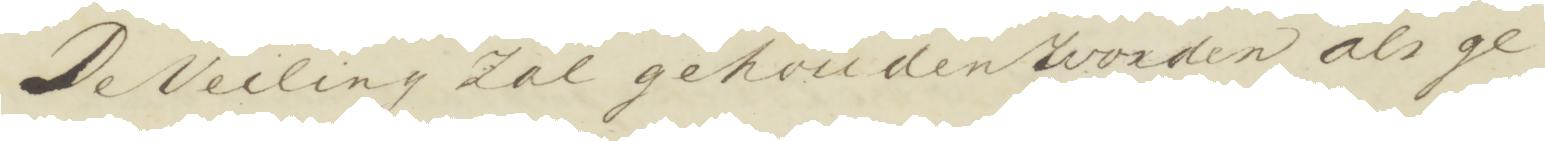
De veiling zal gehouden worden als ge
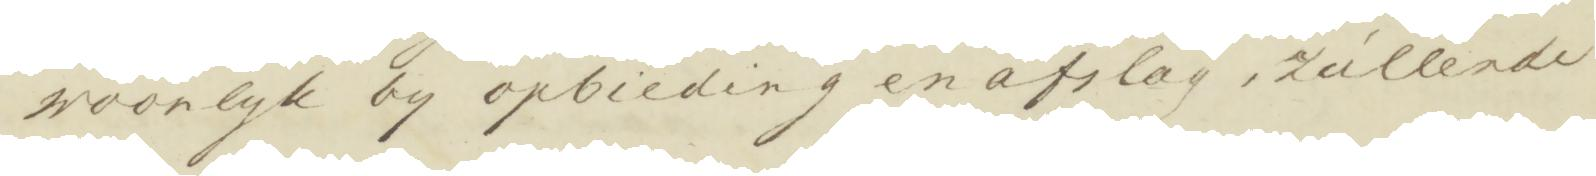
woonlyk by opbieding en afslag, zullende
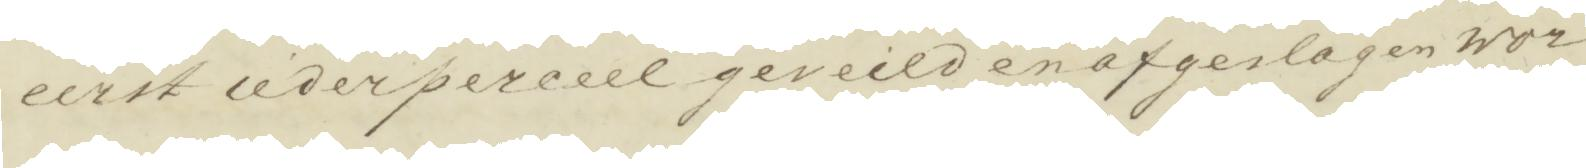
eerst ieder perceel geveild en afgeslagen wor
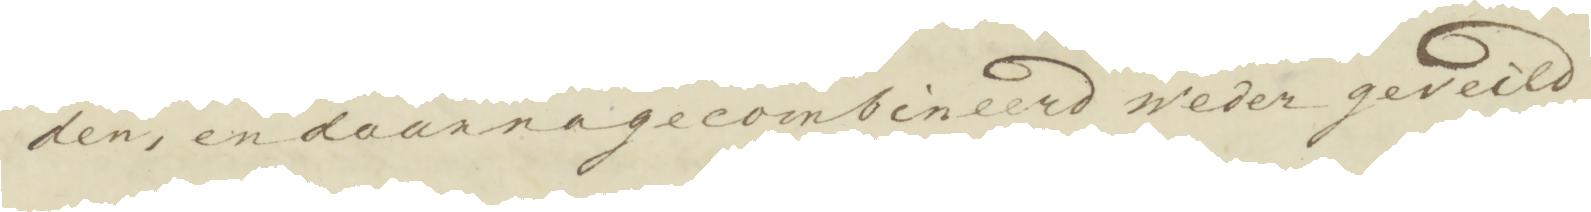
den, en daarna gecombineerd weder geveild
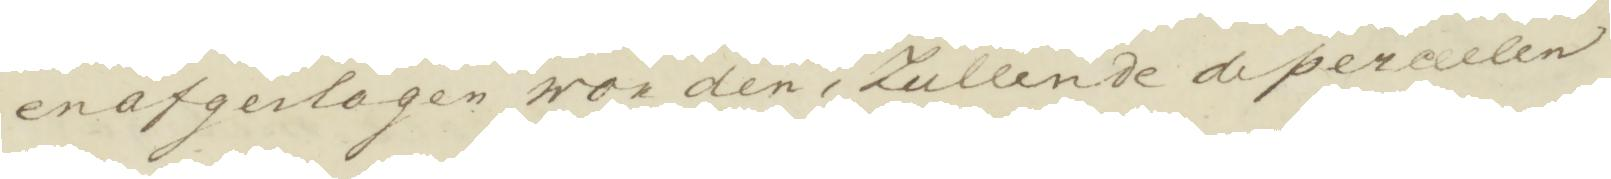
en afgeslagen wor den, zullende de perceelen
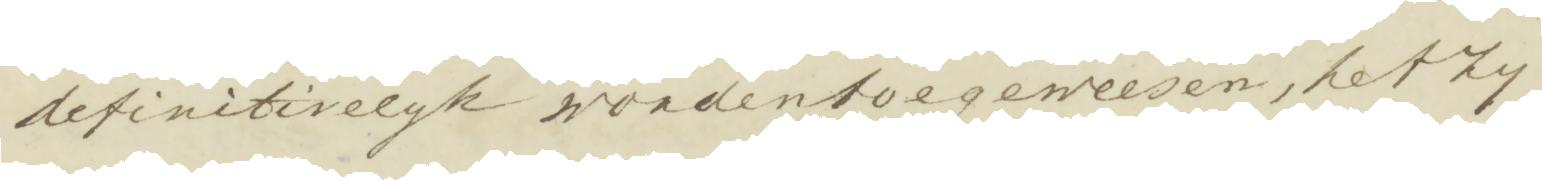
definitivelyk worden toegeweesen, hetzy
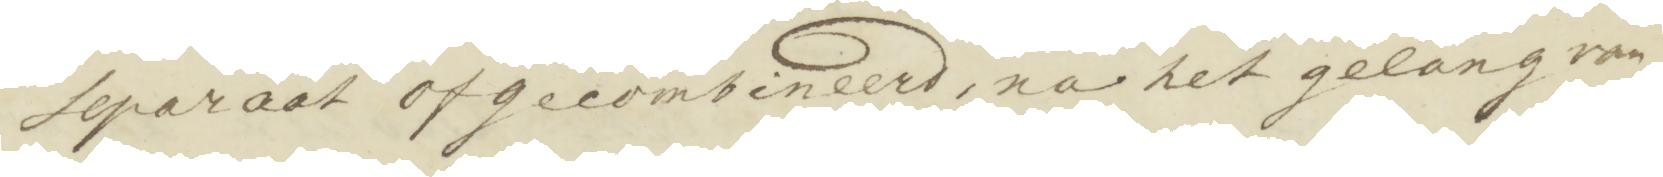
separaat of gecombineerd, na het gelang van
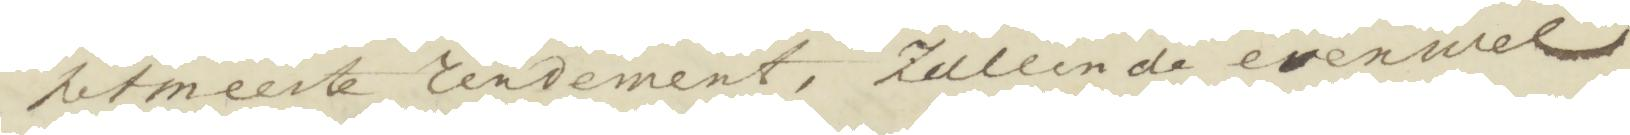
het meeste rendement, zullen de even wel
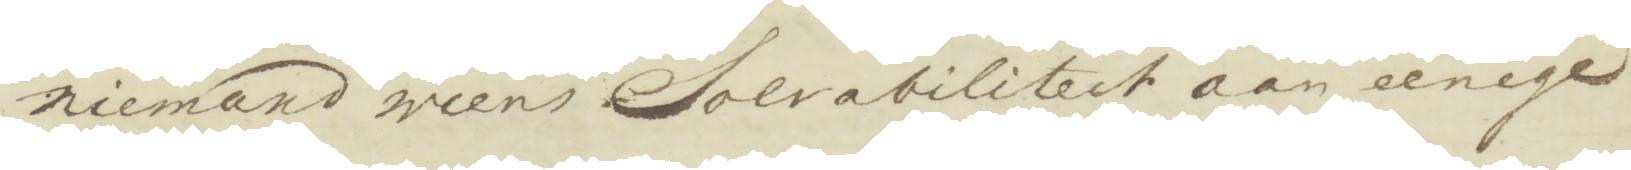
niemand wien solvabiliteit aan eenige
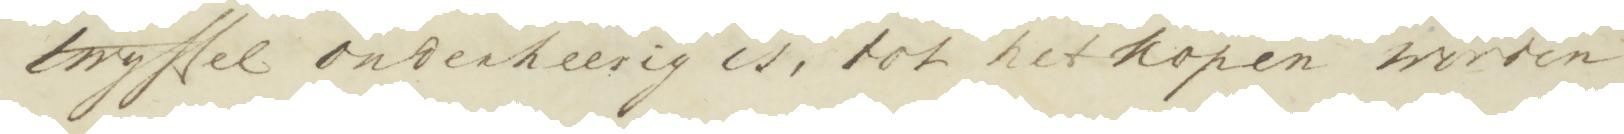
twyffel onderheevig is, tot het kopen worden
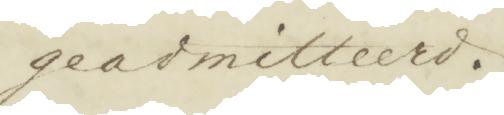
geadmitteerd.
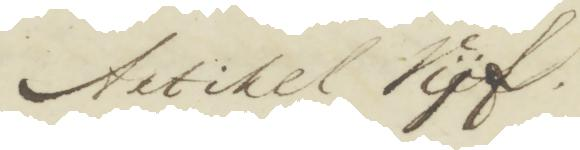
Artikel Vijf.
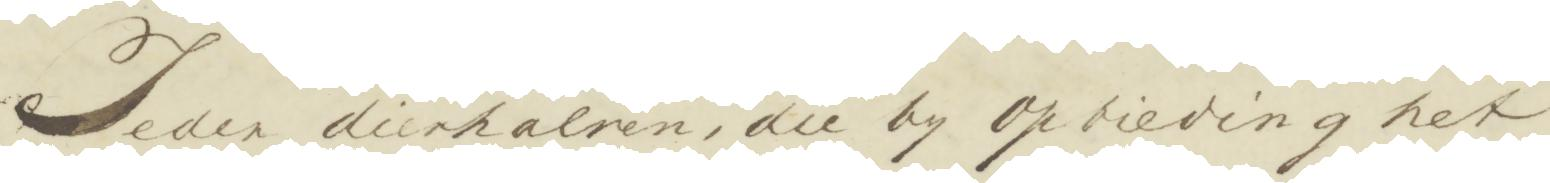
Ieder dierhalven, die by opbieding het
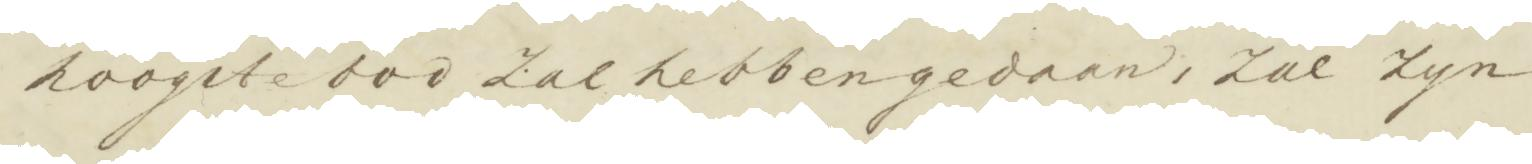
hoogste bod zal hebben gedaan, zal zyn
